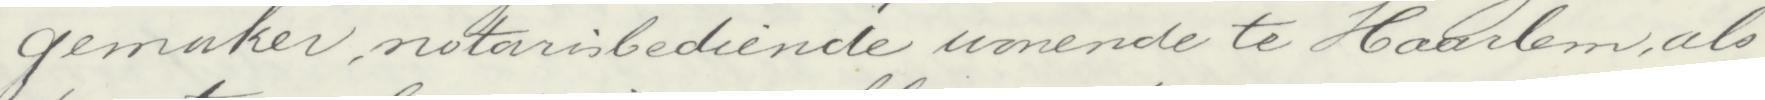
gemaker, notarisbediende wonende te Haarlem, als
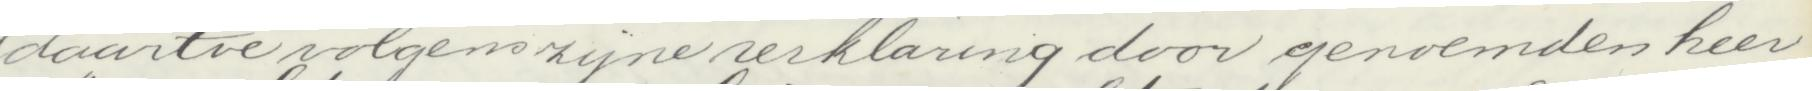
daartoe volgen zijne verklaring door genoemden heer
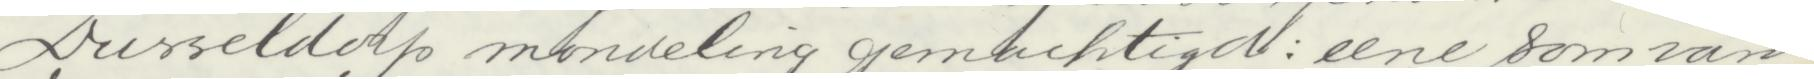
Dusseldorp mondeling gemachtigd: eene som van
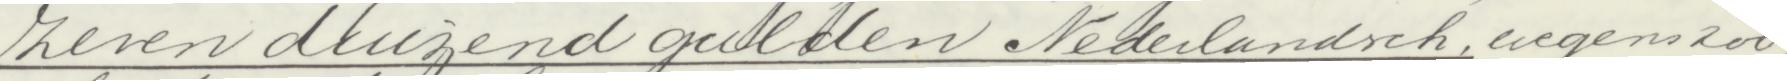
zeven duizend gulden Nederlandsch, wegens zoo
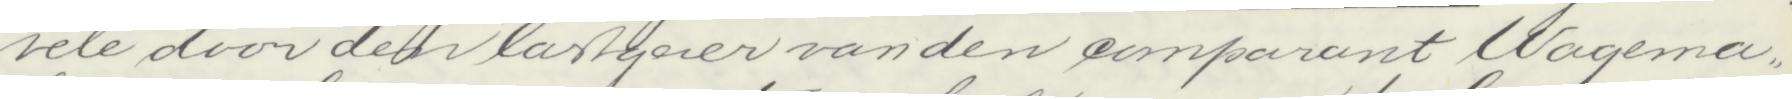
vele door den lastgever van den comparant Wagema„
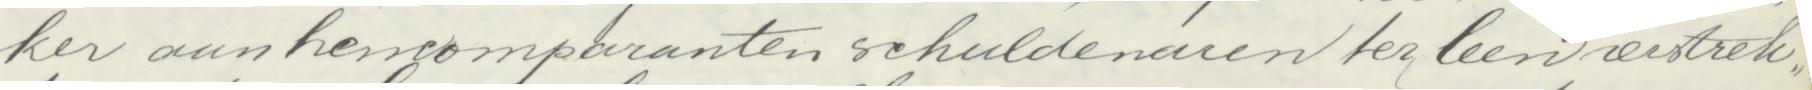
ker aan hen comparanten schuldenaren ter leen verstrek„
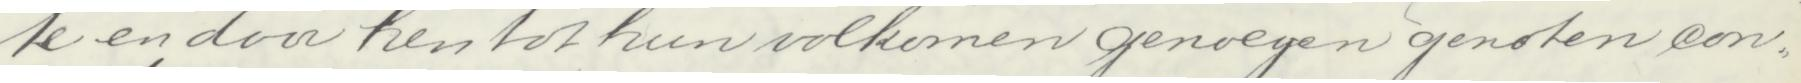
te en door hen tot hun volkomen genoegen genoten con„
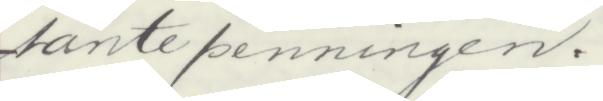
tante penningen.
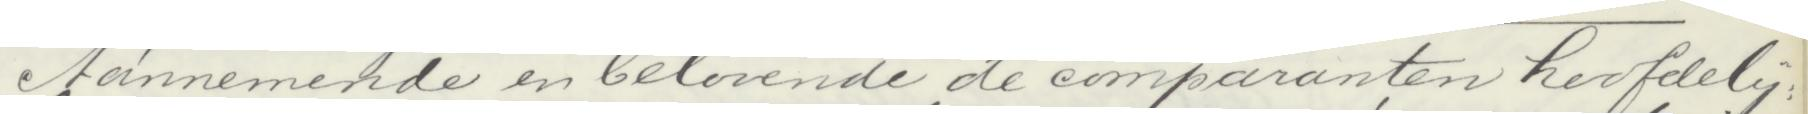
Aannemende en belovende de comparanten hoofdelij„
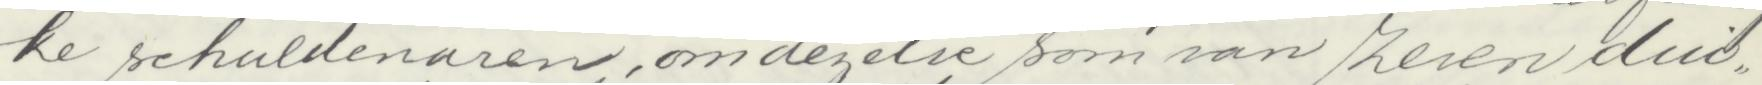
ke schuldenaren, om dezelve som van Zeven dui„
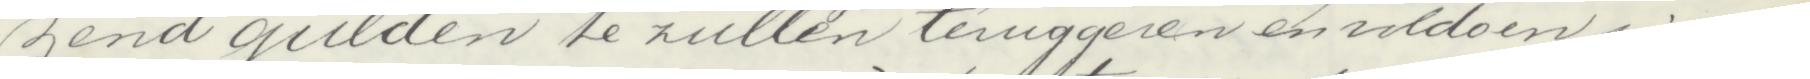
zend gulden te zullen teruggeven en voldoen in eens
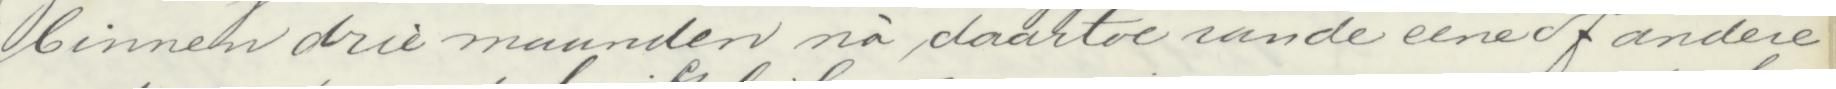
binnen drie maanden nà, daartoe van de eene of andere
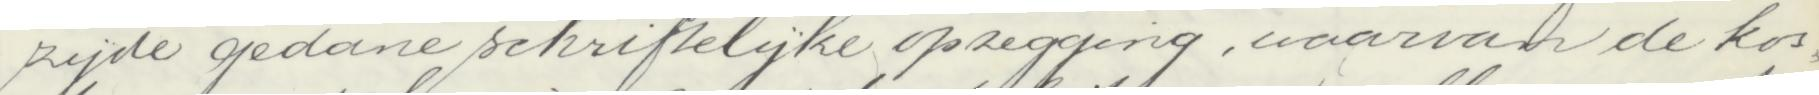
zijde gedane schriftelijke opzegging, waarvan de kos„
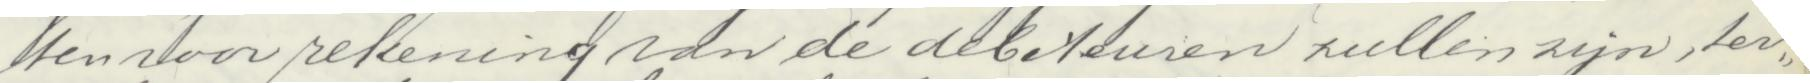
ten voor rekening van de debiteuren zullen zijn, ter„
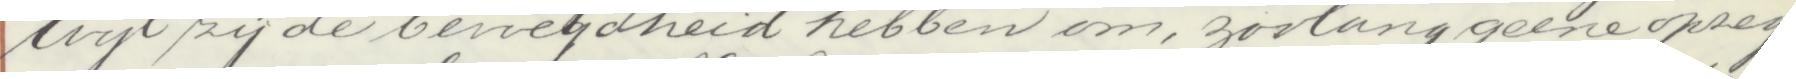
wijl zij de bevoegdheid hebben om, zoolang geene opzeg
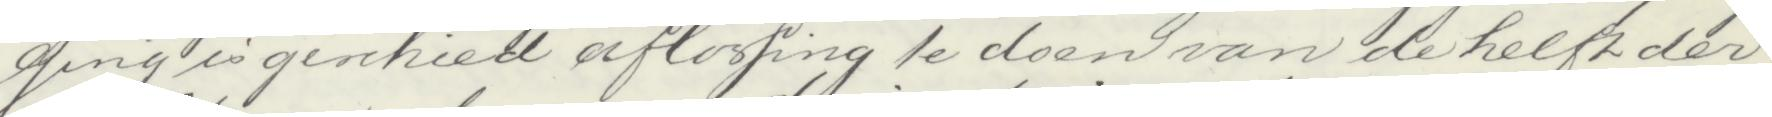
ging is geschied aflossing te doen van de helft der
